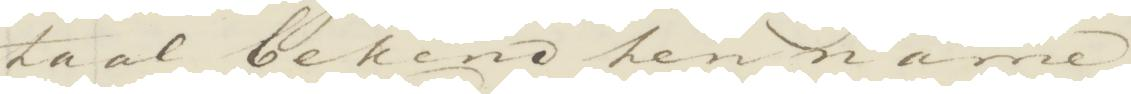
taal bekend ten name
